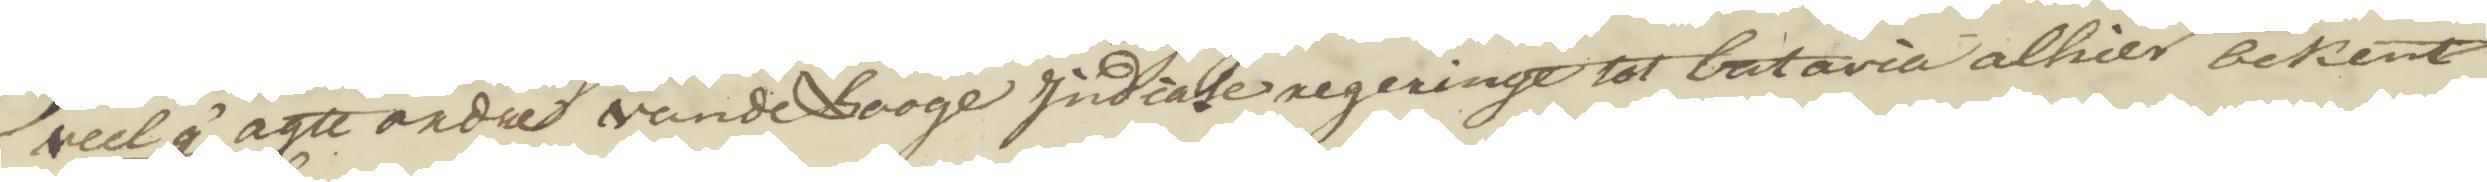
veel g'agte ordre vande hooge Jndiase regeringe tot batavia alhier bekent
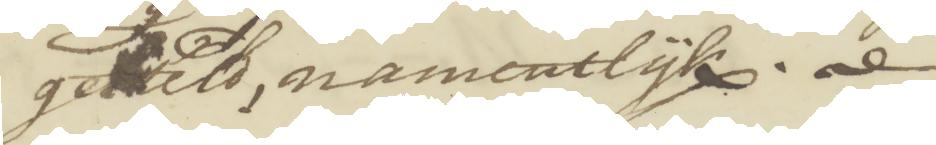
gedteld, namentlijk. —
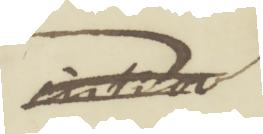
inkoo
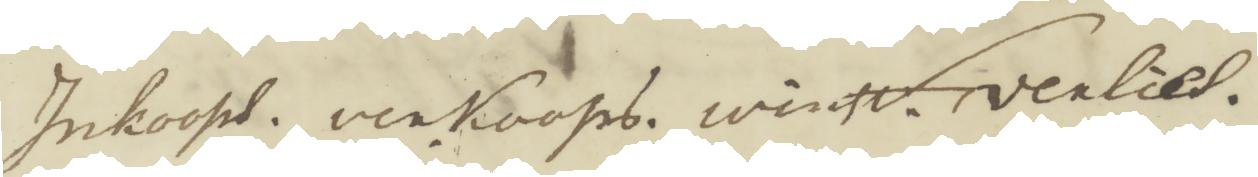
Jnkoops. verkoops. winst. verlies.
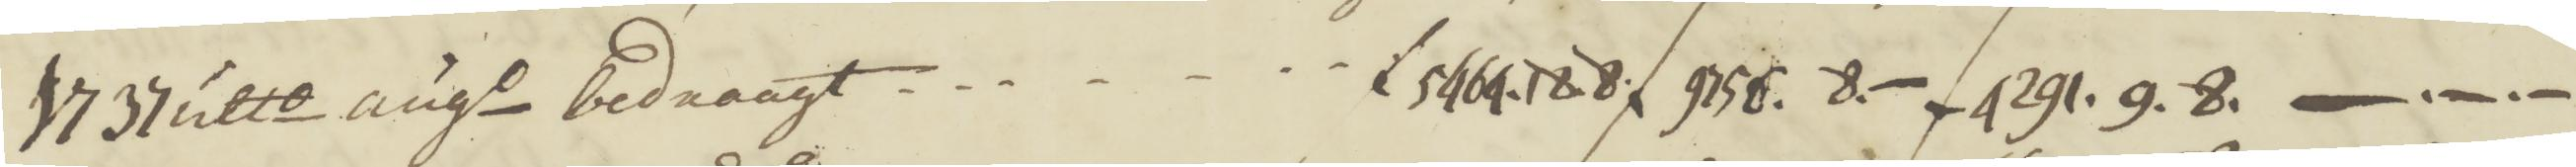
1737 ult–o aug–o bedraagt - - - - - . - ƒ 5464.18.8. ƒ 9756. 8.– ƒ4291. 9. 8. —. —.–
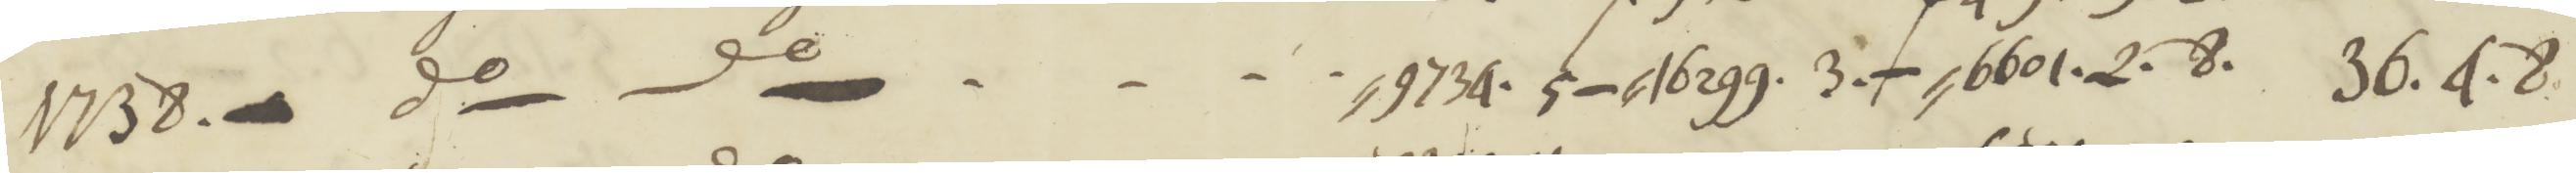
1738.– d–o d–o - - - - „9734. 5 –„16299. 3. – „6601.2. 8. 36.4.8.
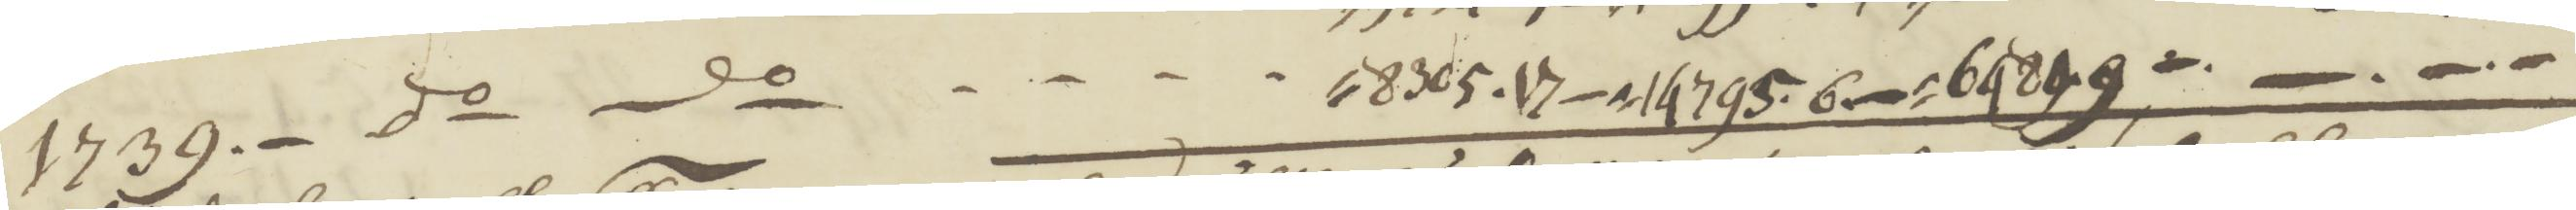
1739.– d–o d–o - - - - „8305.17 –„14795.6.–„64899 –.—.–.–
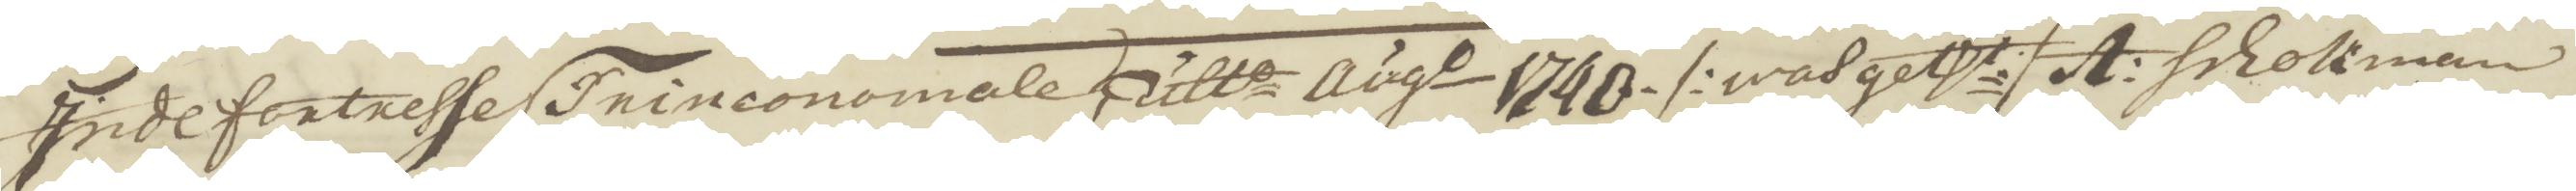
Jnde fortresse Trinconomale ult=o aug–o 1740. /:was get=t:/ A: schokman
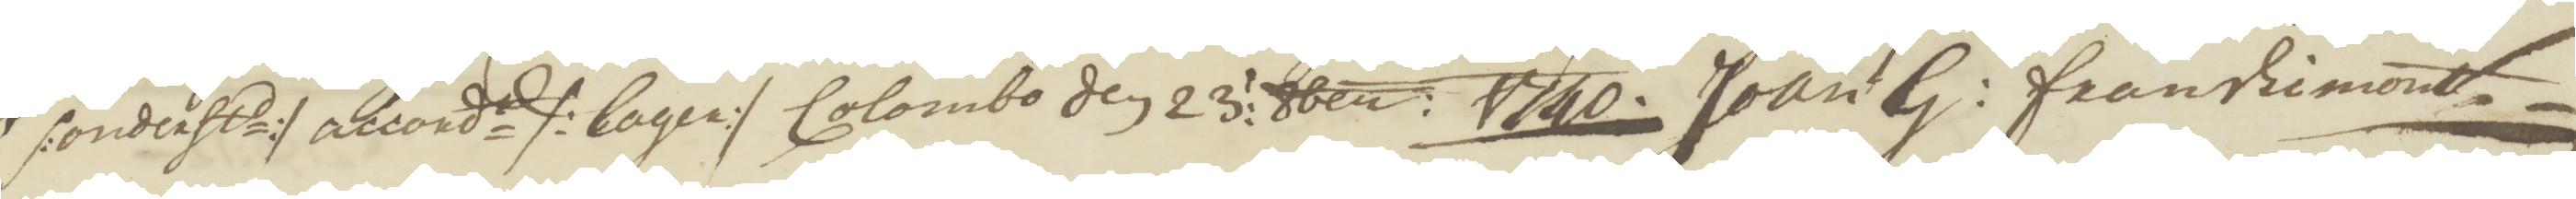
/:onderst=d:/ accord=rd /:lager:/ Colombo den 23:' 8ber: 1740. Joan G: franchimont. —
